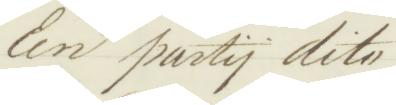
Een partij dito
